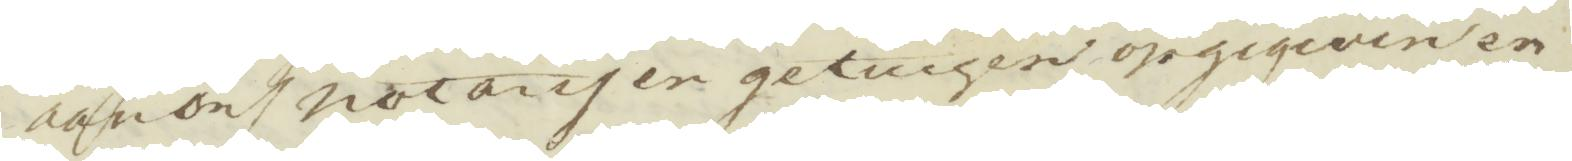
aan ons notaris en getuigen opgegeven en
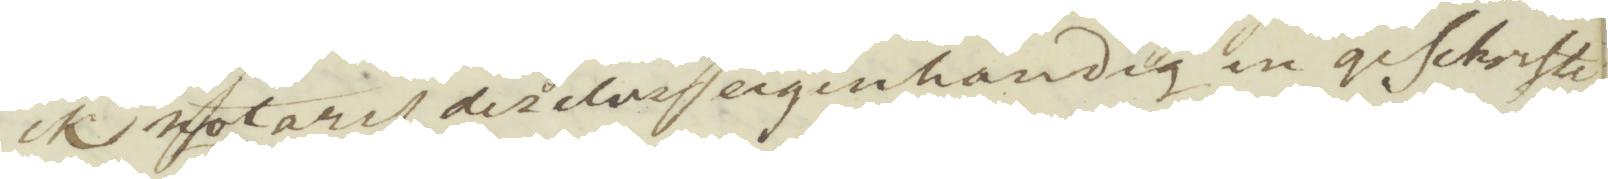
ik notaris dezelve eigenhandig in geschrifte
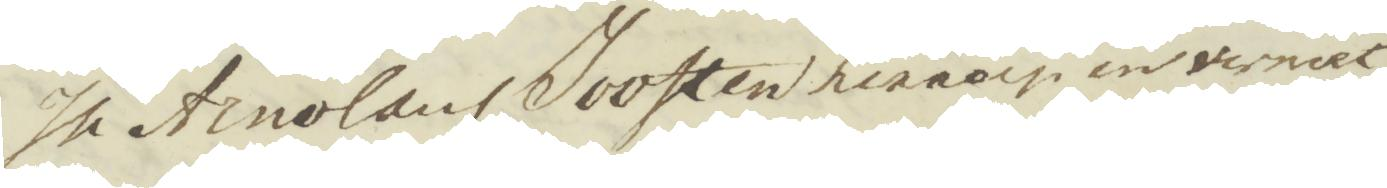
Jk Arnoldus Joosten herroep in verniet
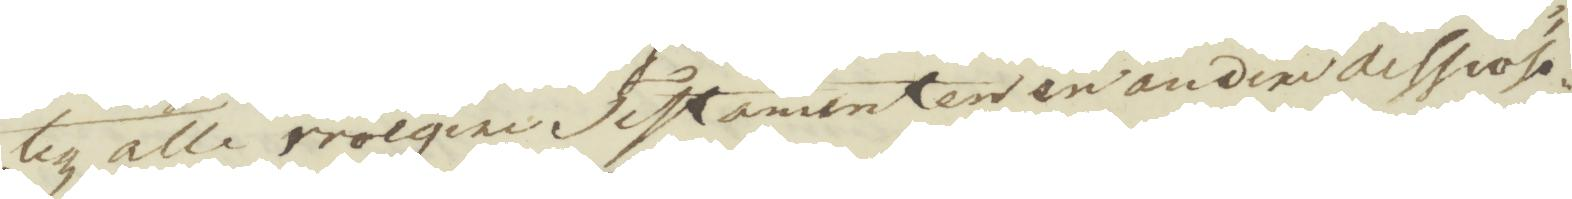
tig alle vroegere Testamenten en andere disposi„
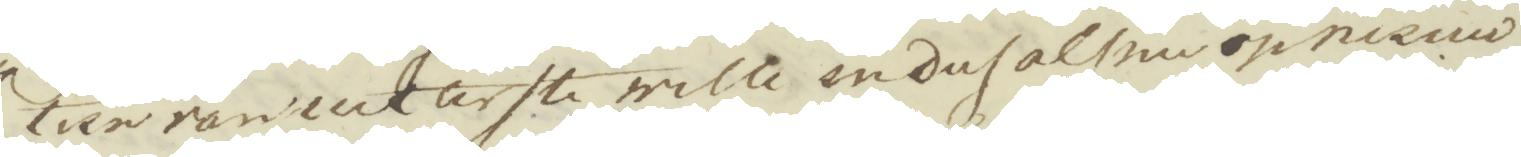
tien van uitterste wille en dus als nu opnieuw
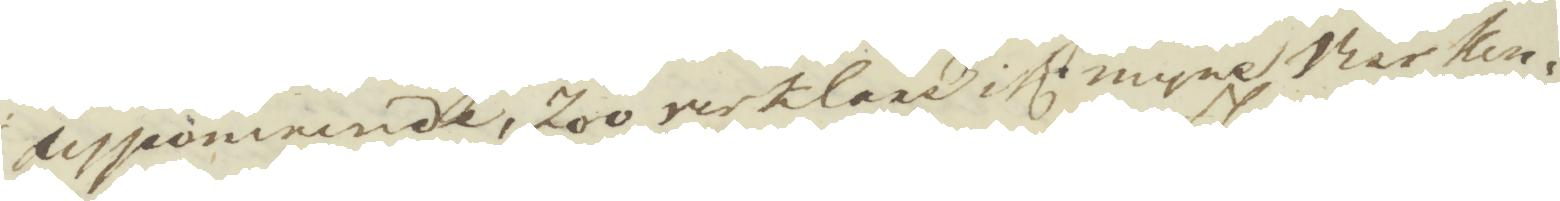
disponerende, zoo verklare ik myne Vier kin„
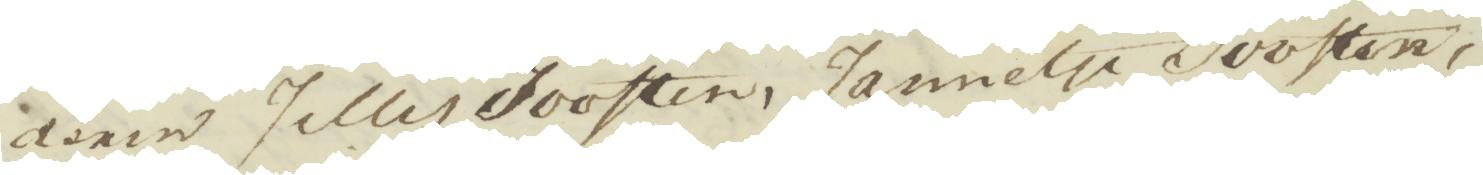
deren Jillis Joosten, Jannetje Joosten,
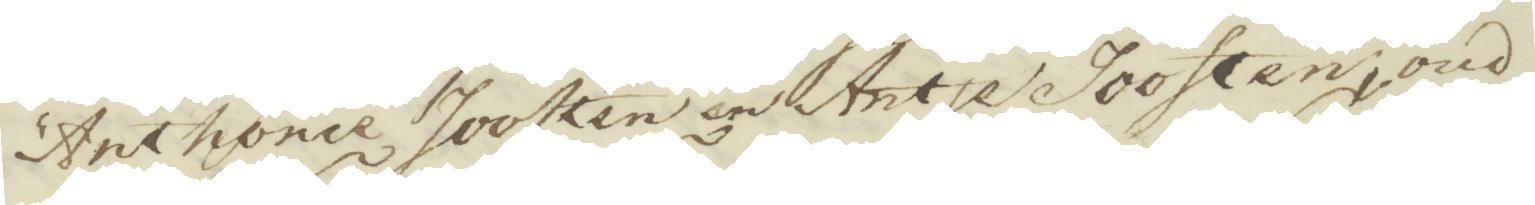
Anthonie Joosten en Antje Joosten, oud
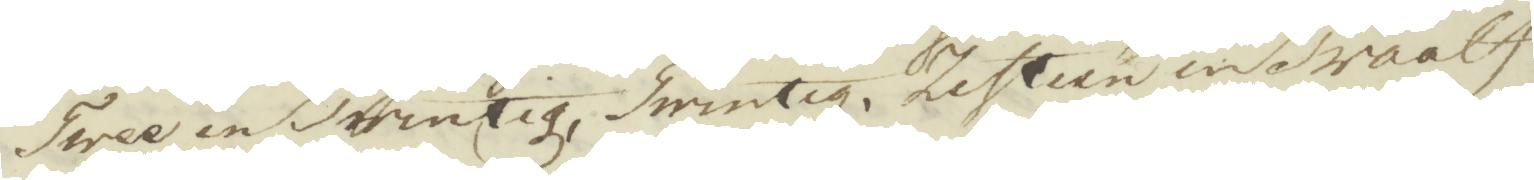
Twee en Twintig, Twintig, Zestien en Twaalf
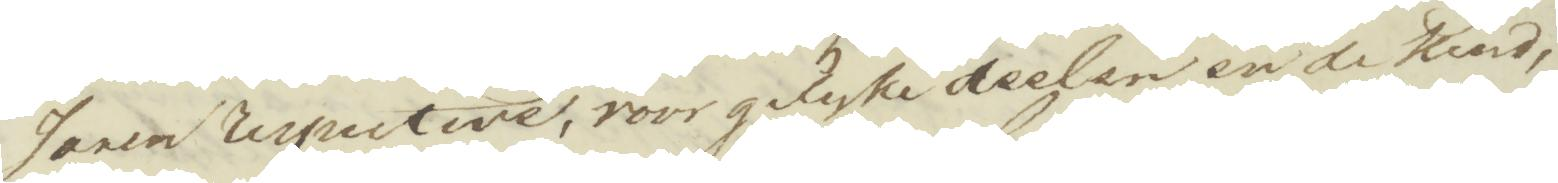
Jaren respective, voor gelyke deelen en de kind,
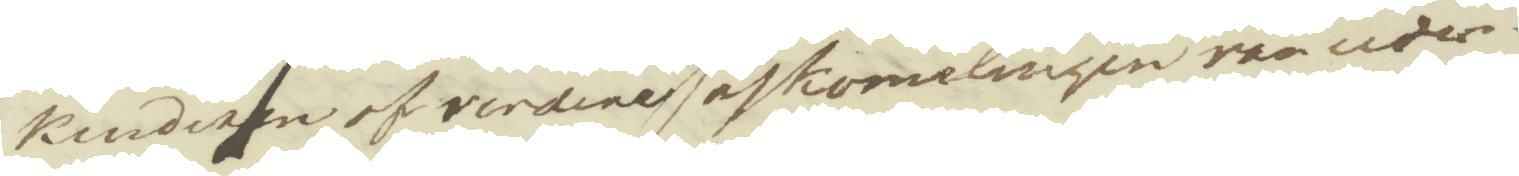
kinderen of verdere afkomelingen van ieder
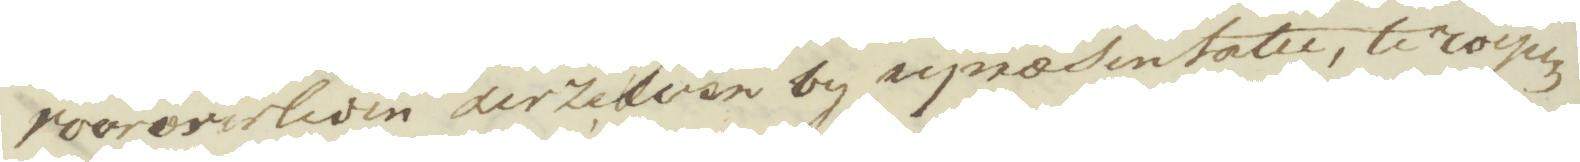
vooroverleden derzelven by representatie, te roepen
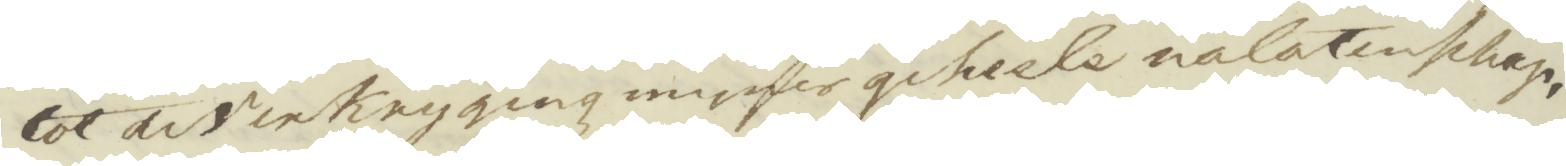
tot de verkryging myner geheele nalatenschap,
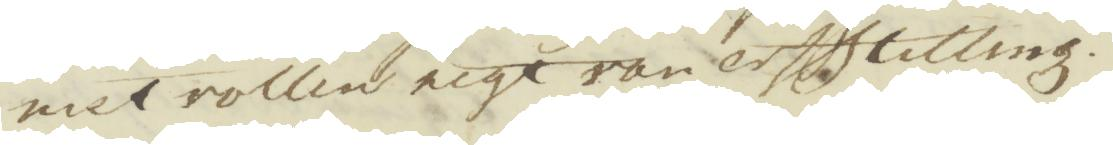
met vollen regt van erfstelling.
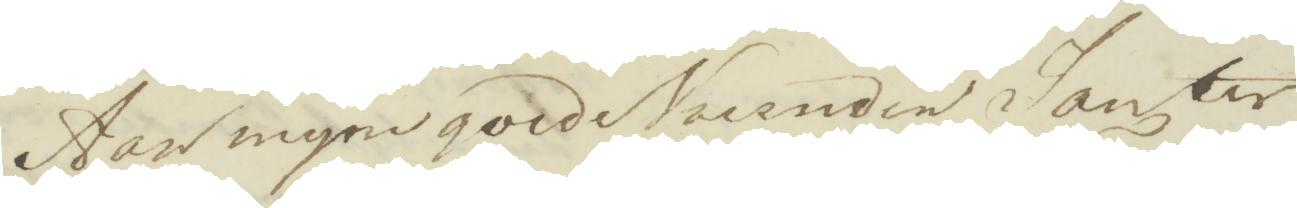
Aan myne goede Vrienden Jan ter
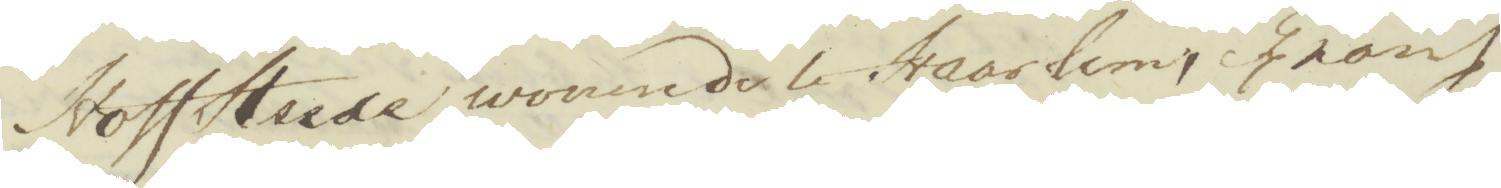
Hoffsteede wonende te Haarlem, Frans
